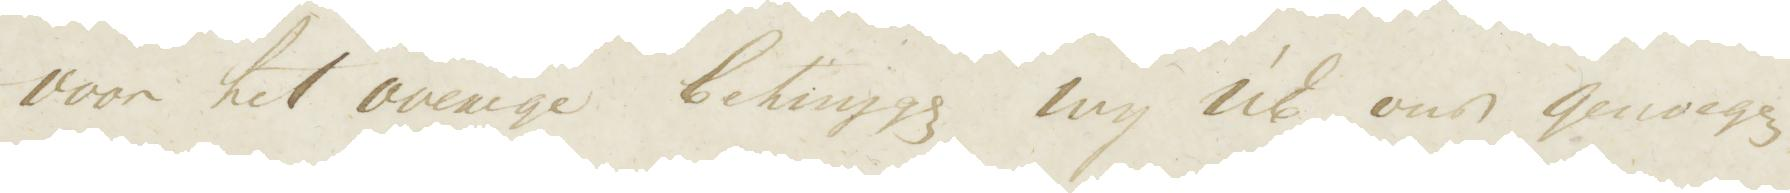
voor het overige betuygen wy uE ons genoegen
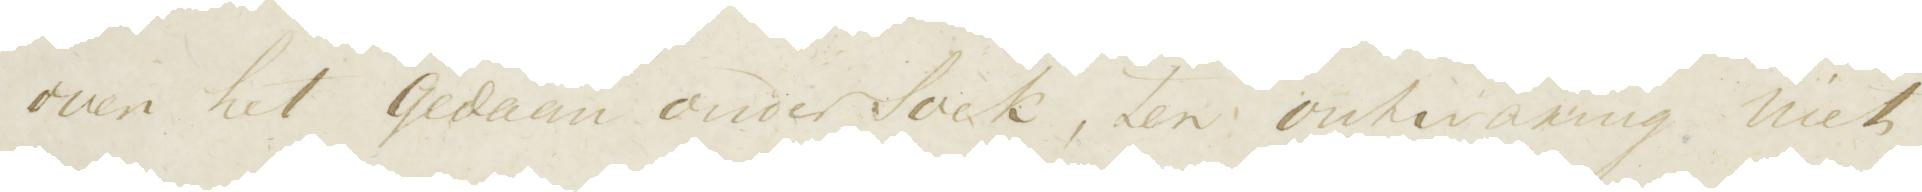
doen het gedaan ondersoek, ter ontwaring niet
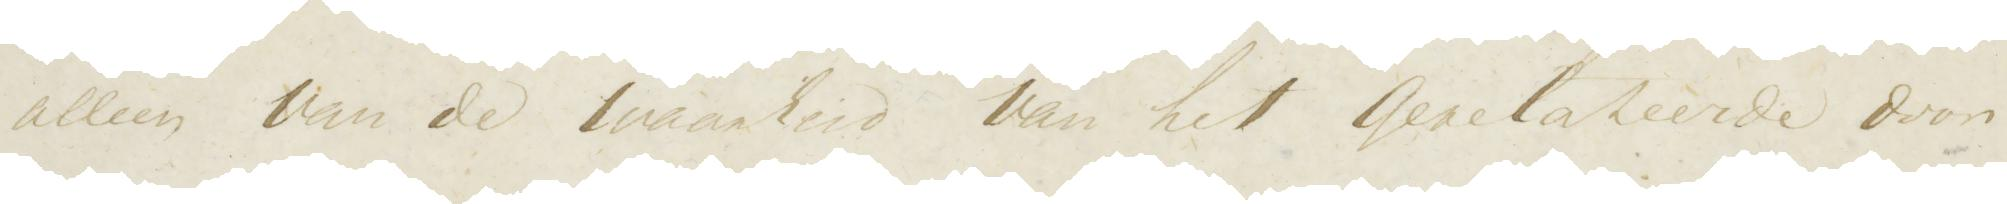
alleen van de waarheid van het gerelateerde door
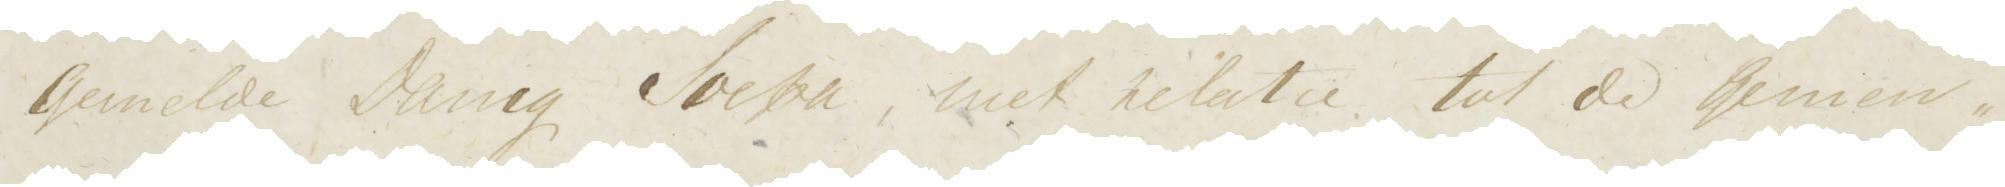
gemelde Danig Soepa, met relatie tot de gemen„
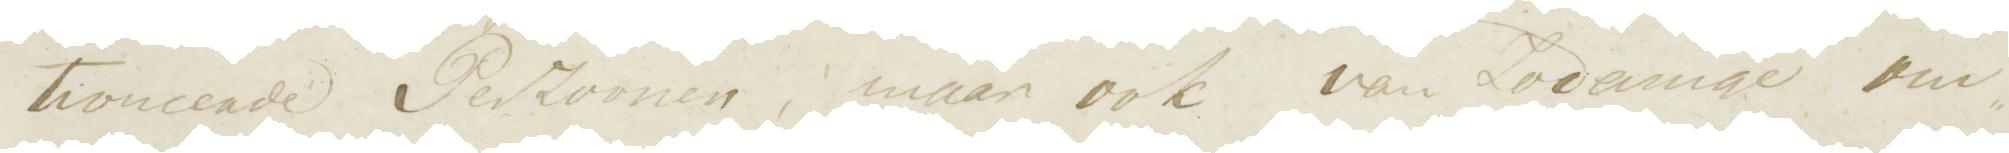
tioneerde Perzoonen, maar ook van zodanige om„
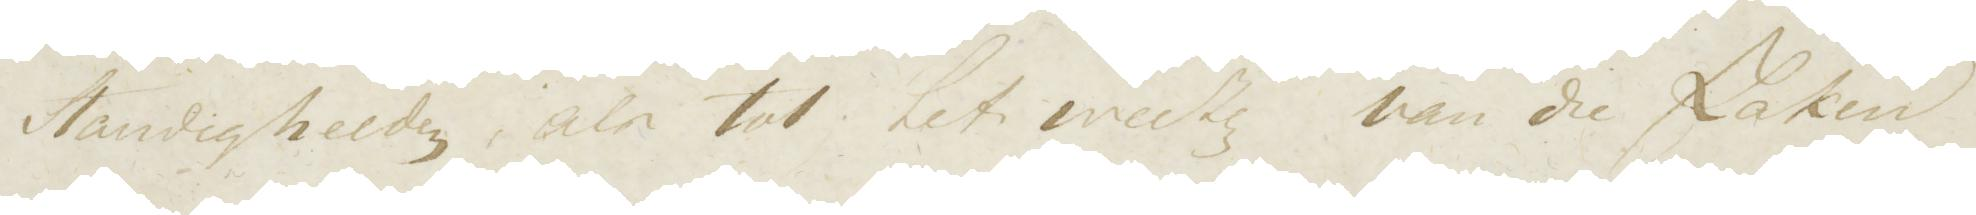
standigheeden, als tot het weeten van die zaken
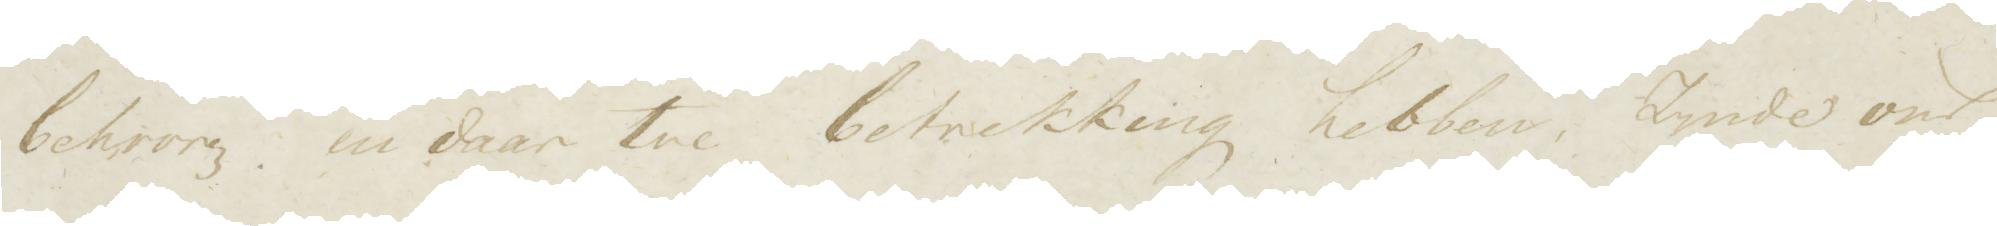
behooren in daar toe betrekking hebben, zynde ons
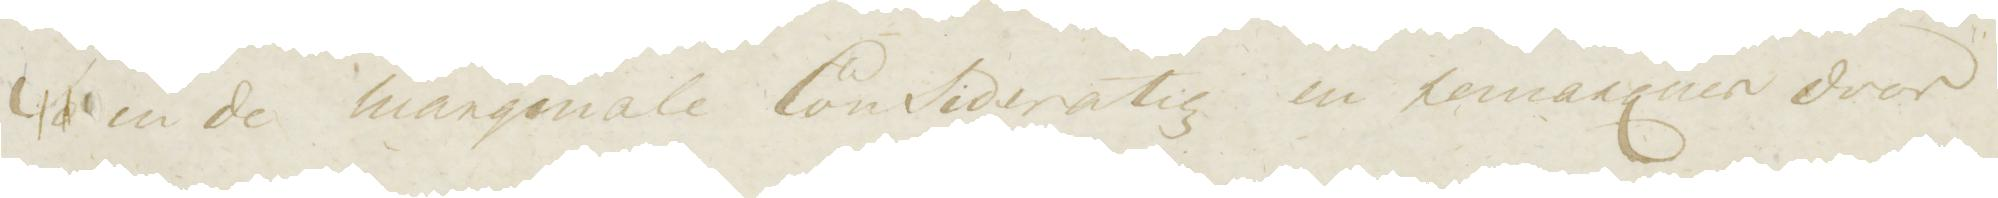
41 in de marginale Consideratien en remarques door
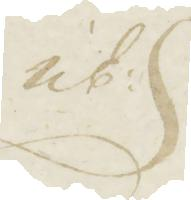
uE:S
